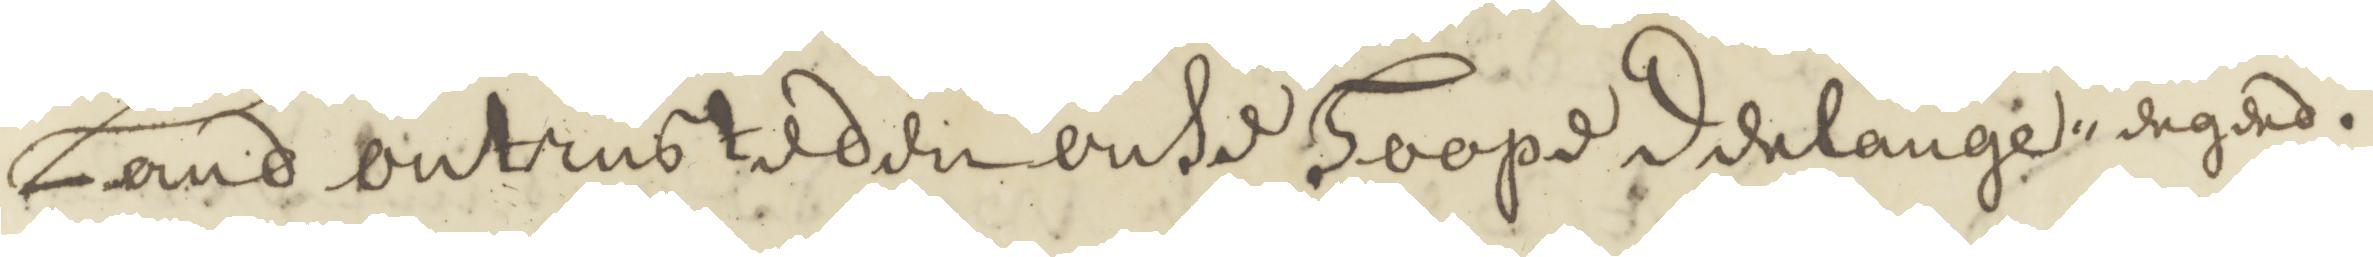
Land ontruste den onse hoope Eerlange „ergerd.
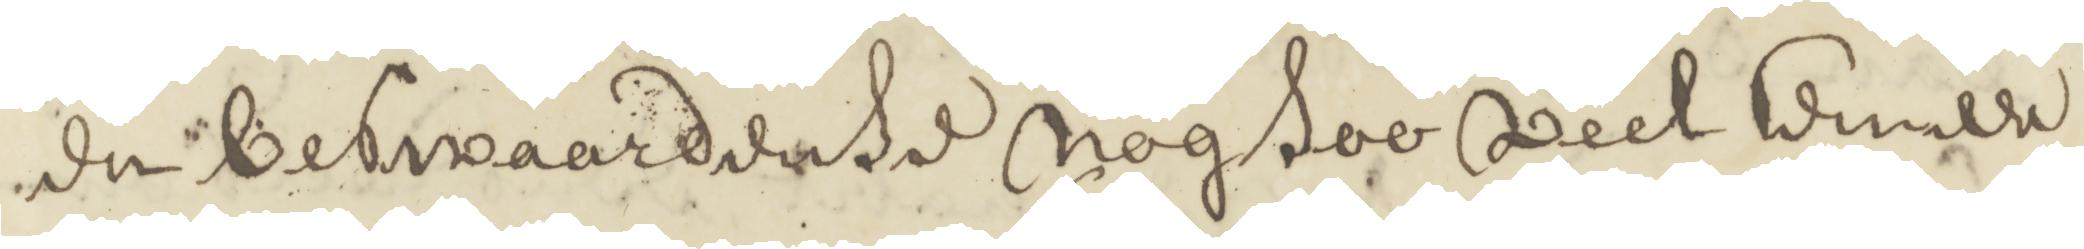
en beswaardense nog soo veel temeer
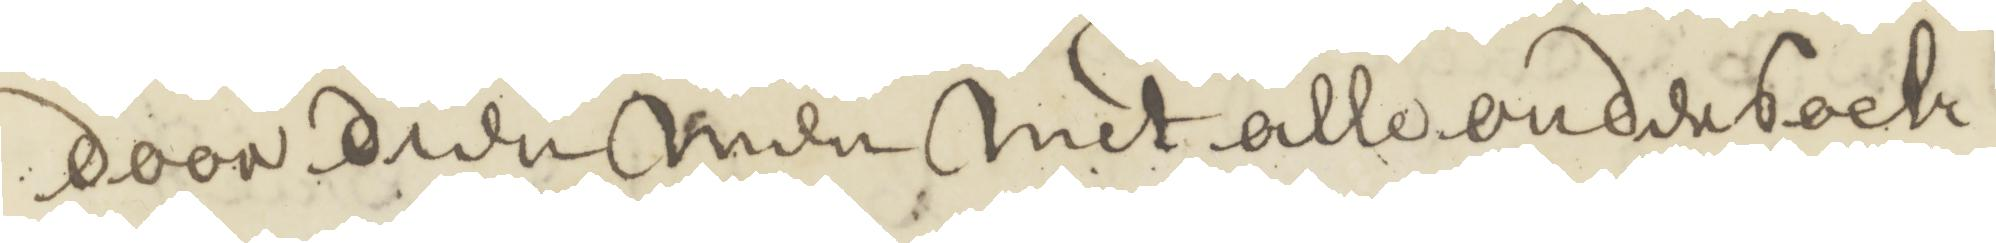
door dien men met alle ondersoek
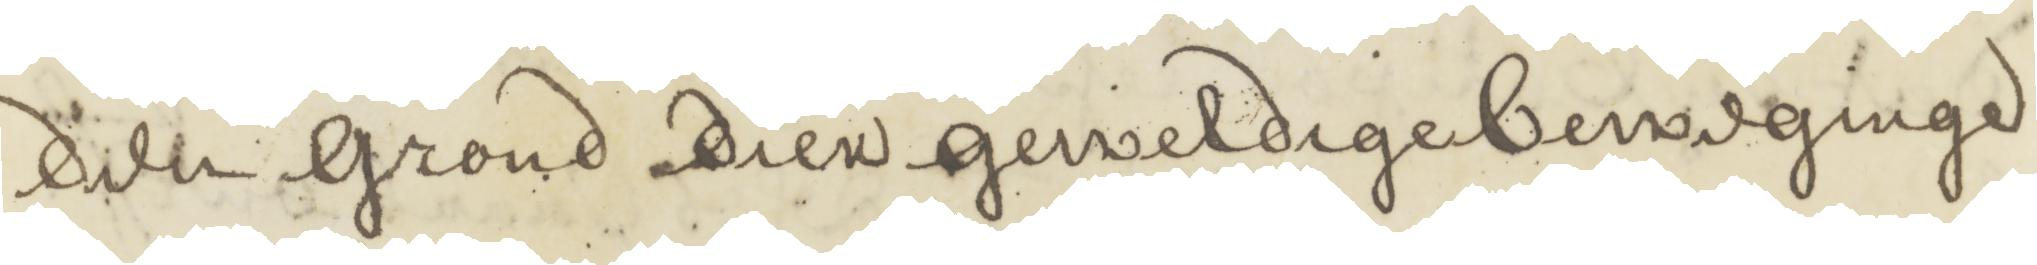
den grond dier geweldige beweginge
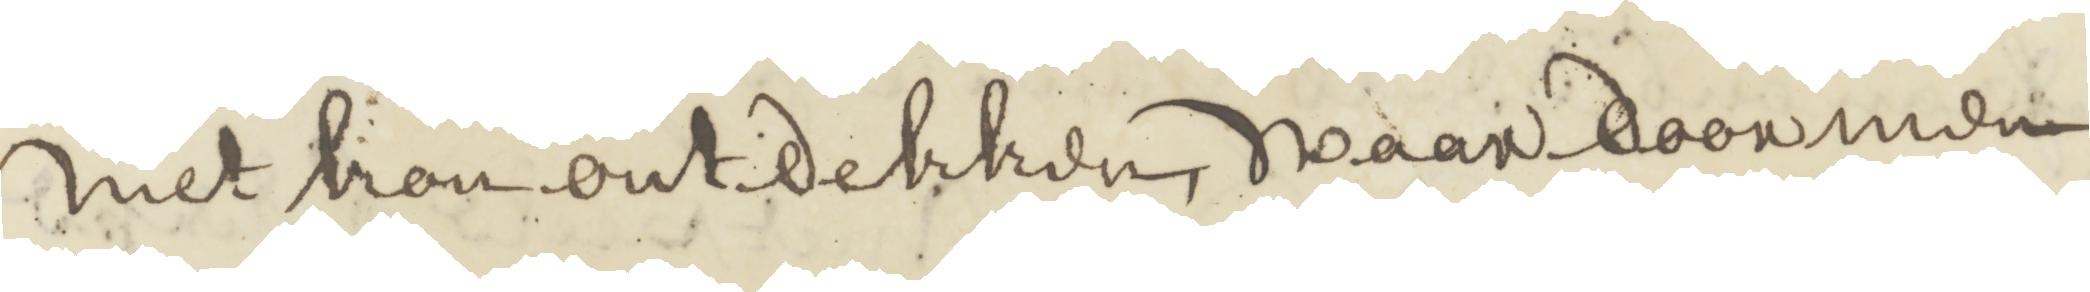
niet kon ontdekken, waar door men
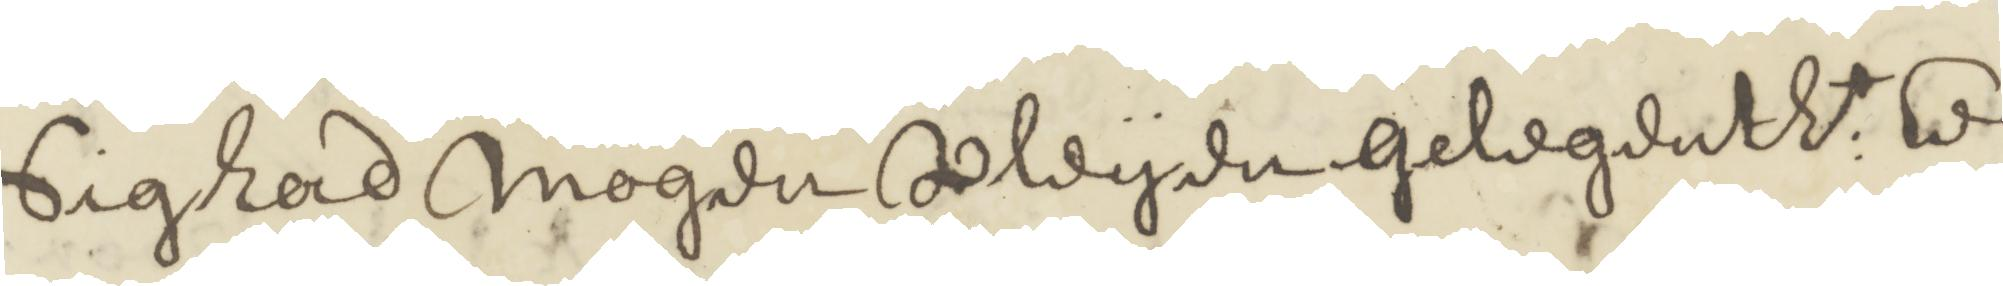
sig had mogen vleijen gelegenth:t te
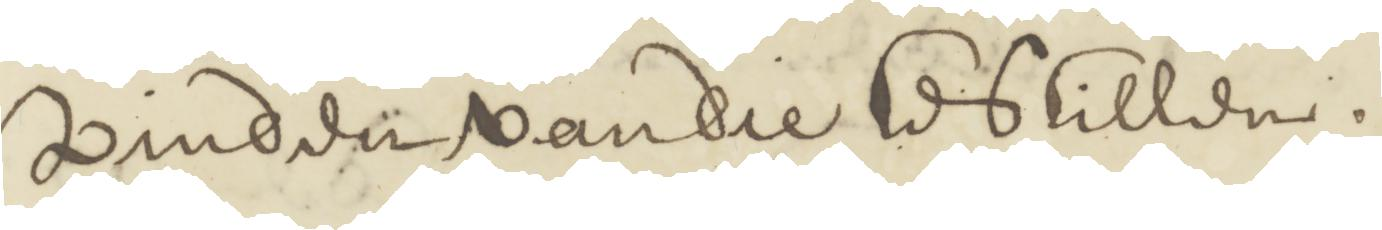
vinden van die te stillen.
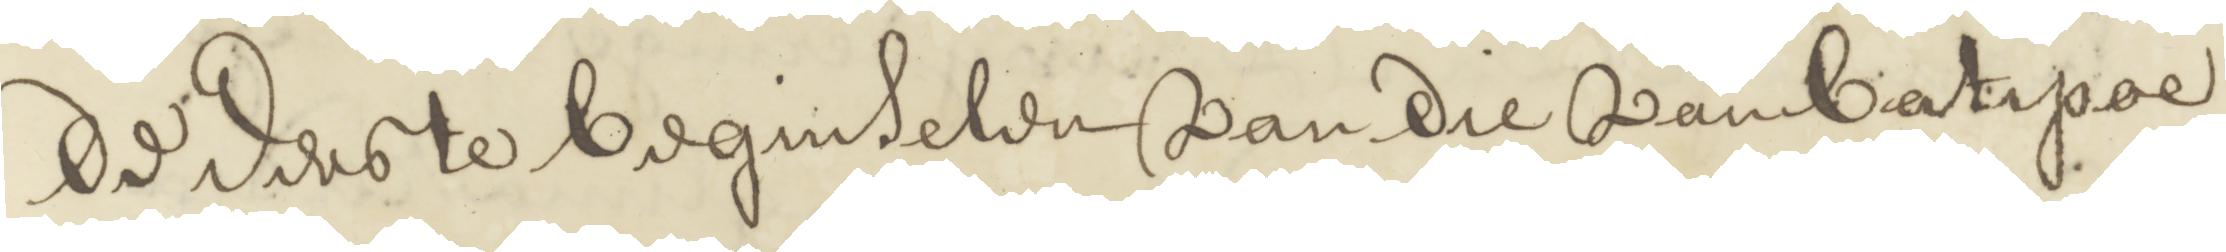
de Eerste beginselen van die van Batipoe
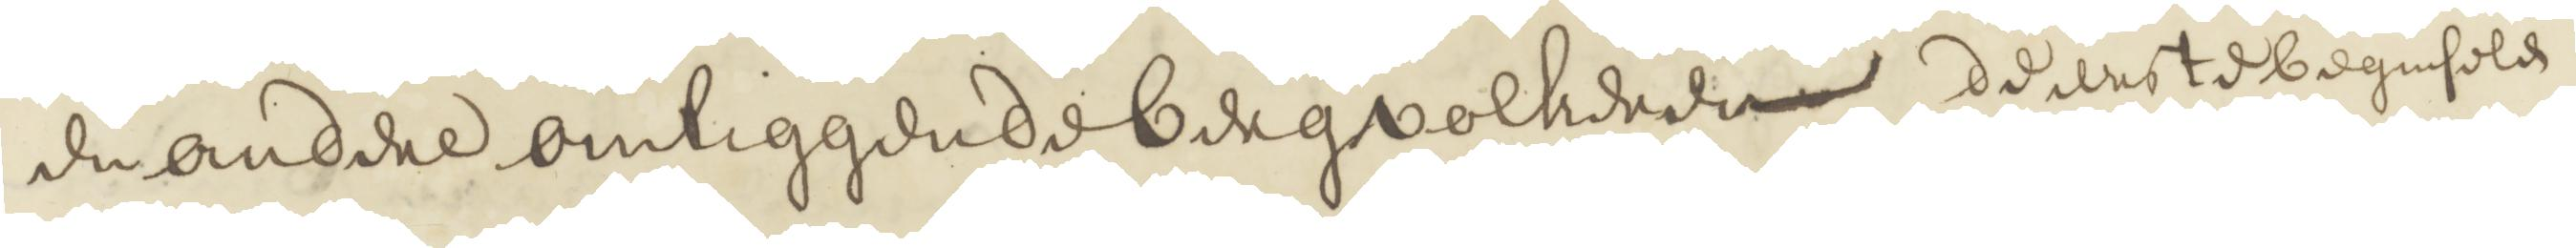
en andere omliggende bergvolkeren de eerste beginselen
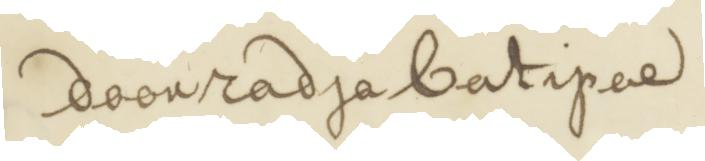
door radja batipoe
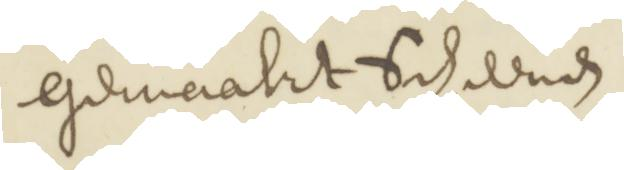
gemaakt scheenen
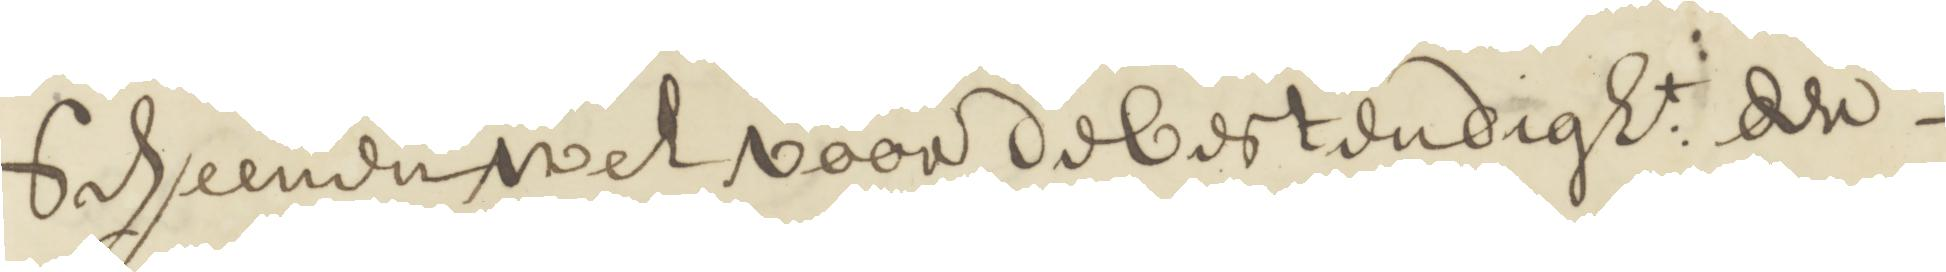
scheenen wel voor de bestendigh:t der
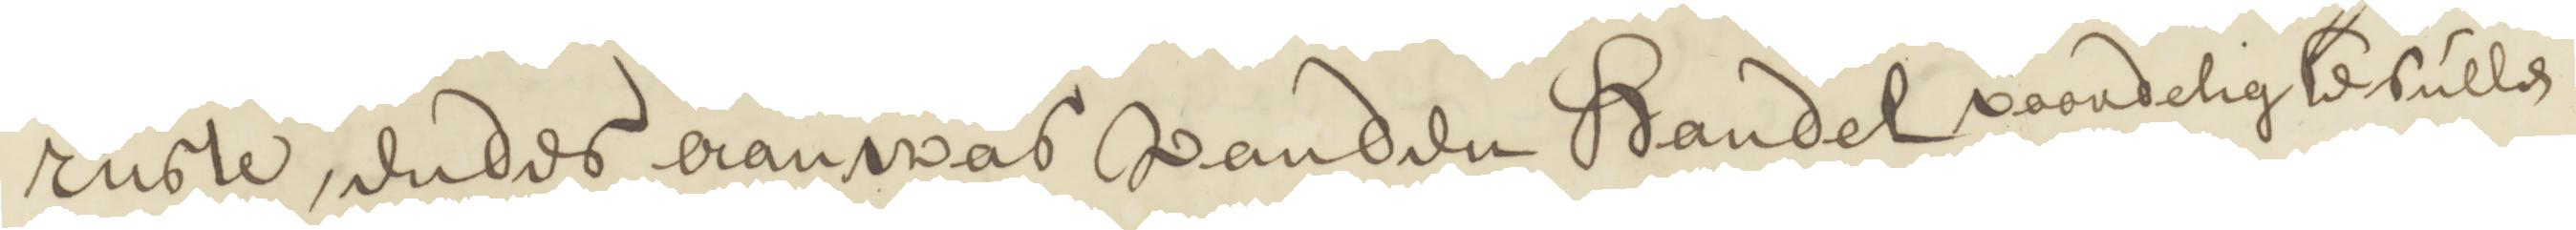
ruste, en des aanwas van den handel voordelig te sullen
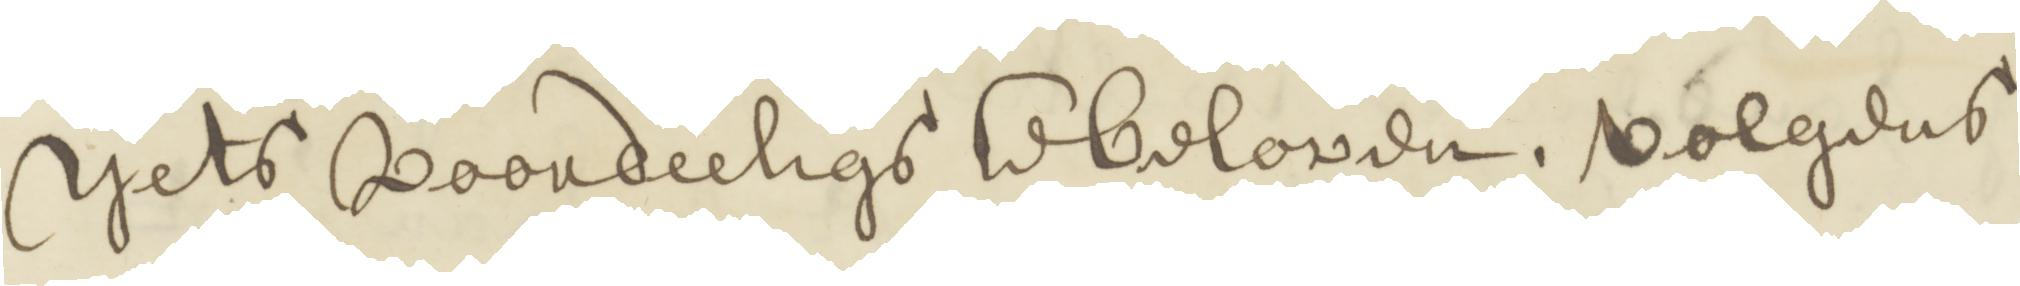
Jets voordeeligs te beloven, volgens
